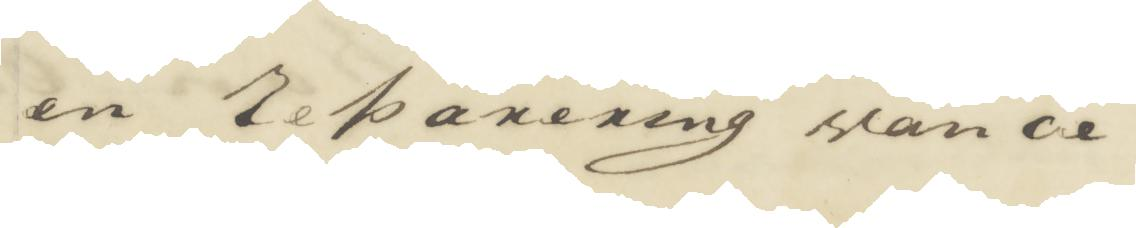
en reparering van de
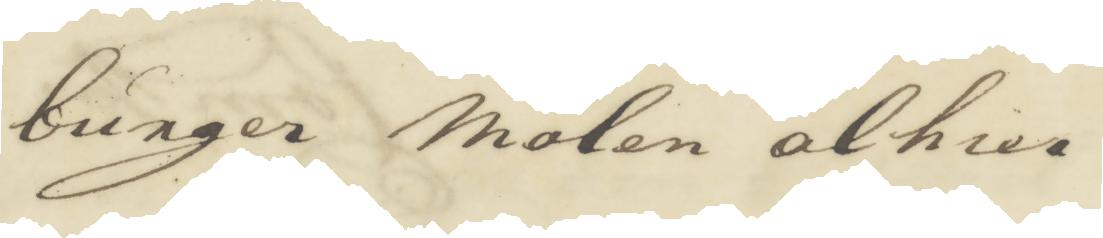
burger molen alhier
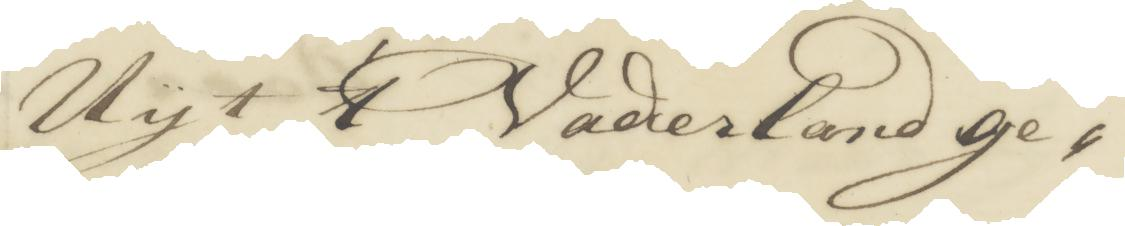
Uijt ’t Vaderland ge„
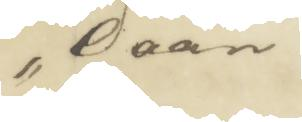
„daan
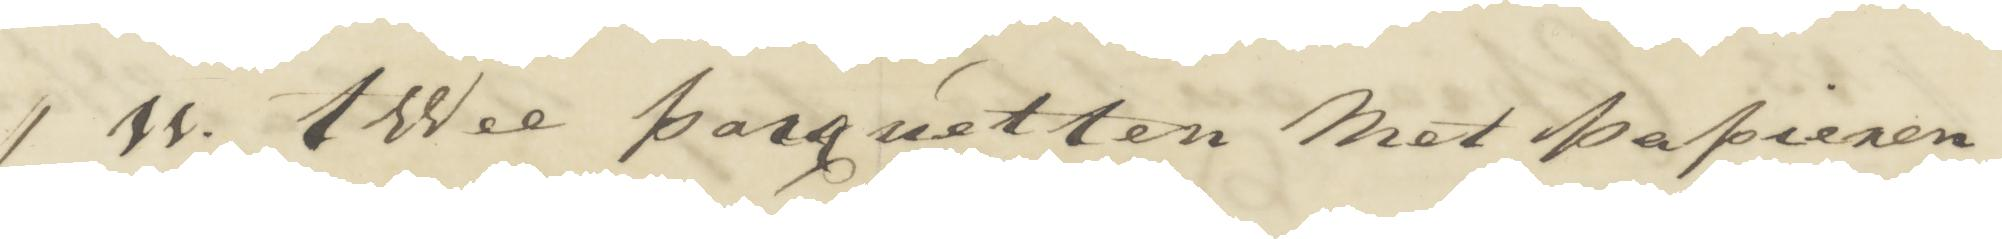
„ 11. twee pacquetten met papieren
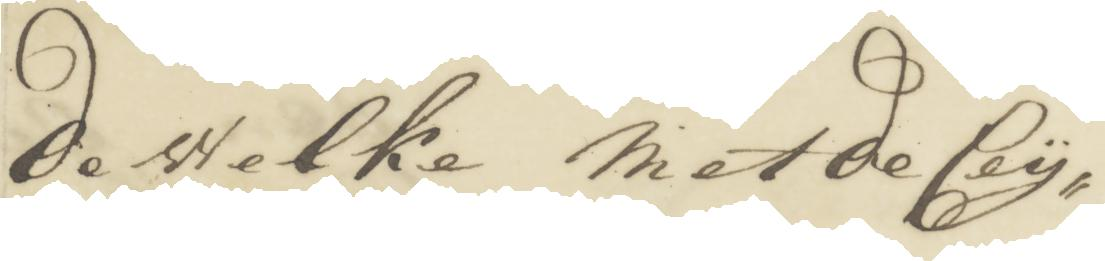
de welke met de Ceij„
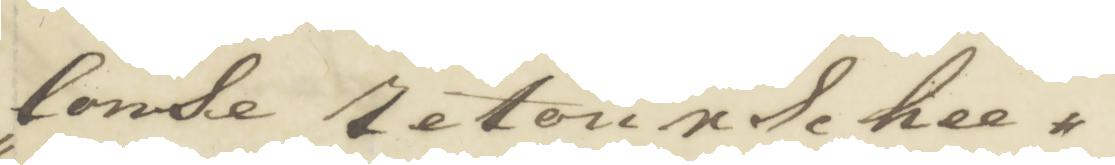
lonse retourschee„
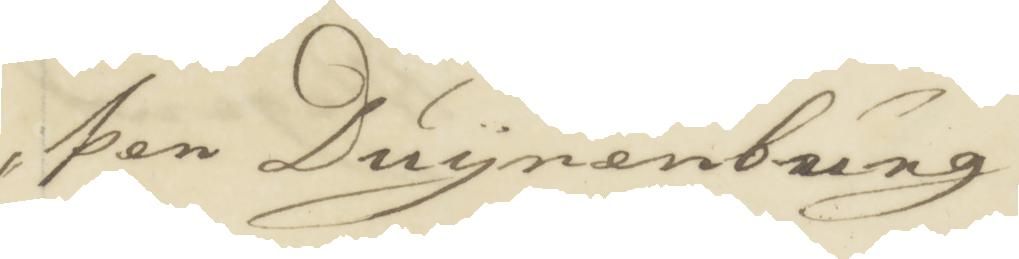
„per Duijnenburg
